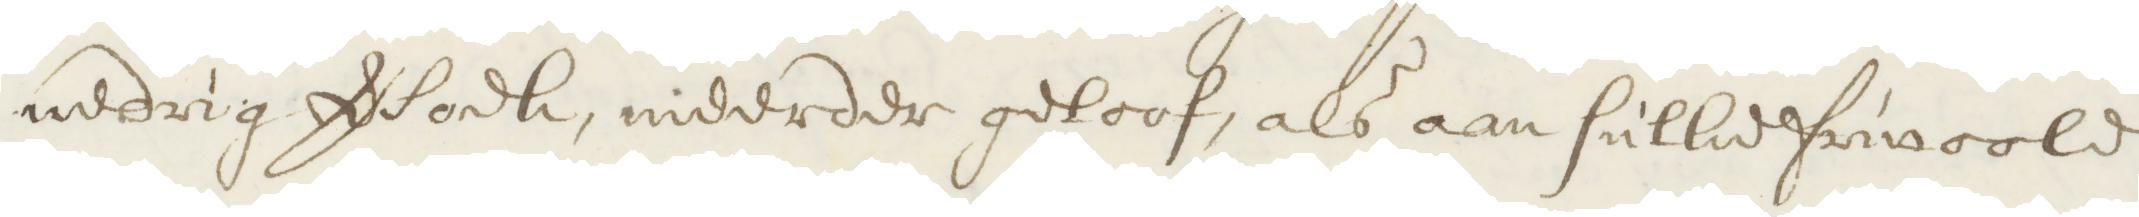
nedrig Versoek, meerder geloof, als aan sulke frivoole
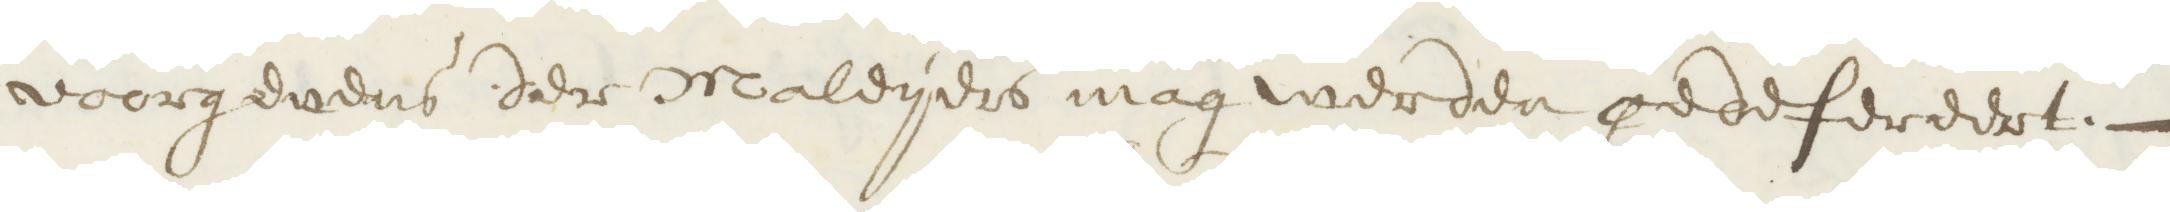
voorgevens der Maleijers mag werden gedefereert.
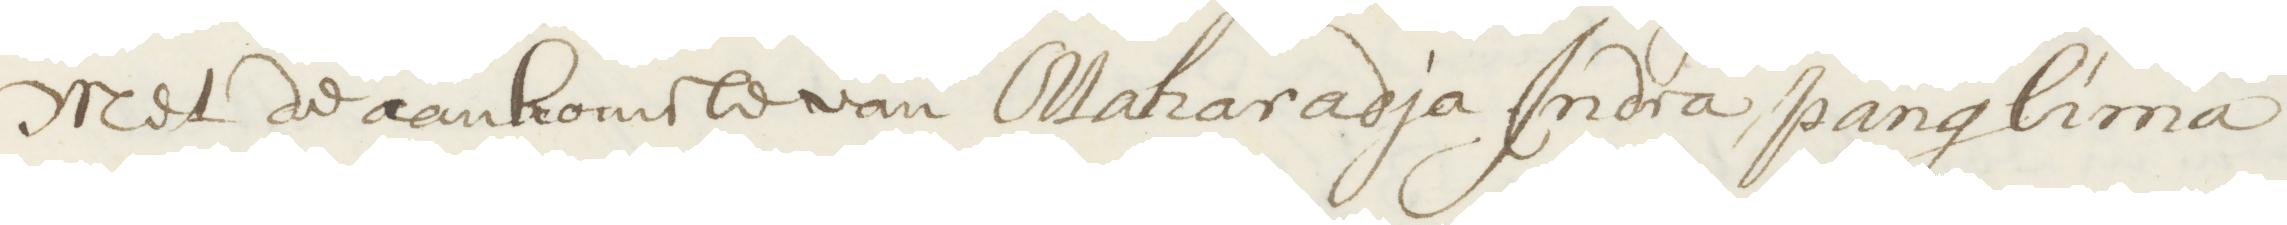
Met de aankomste van Maharadja Jndra, panglima
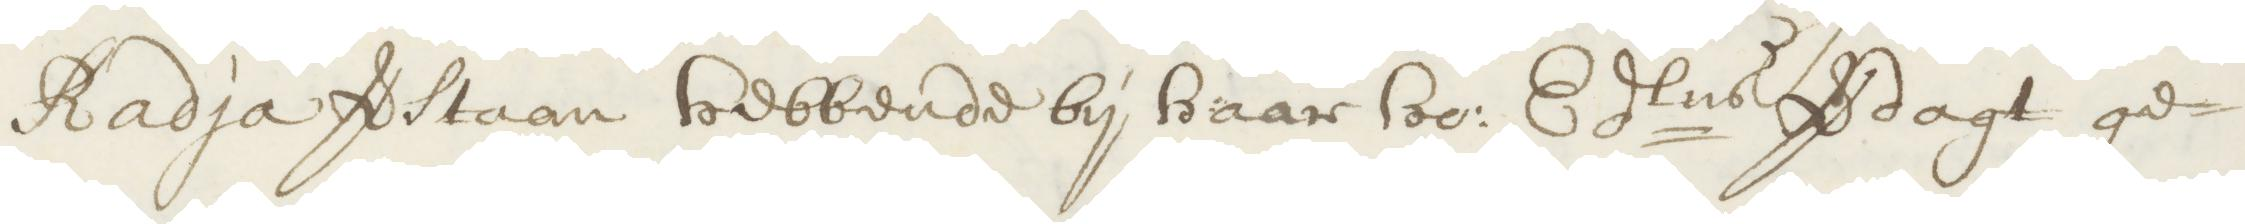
Radja Verstaan hebbende bij haar ho: Ed:lns Verdagt ge=
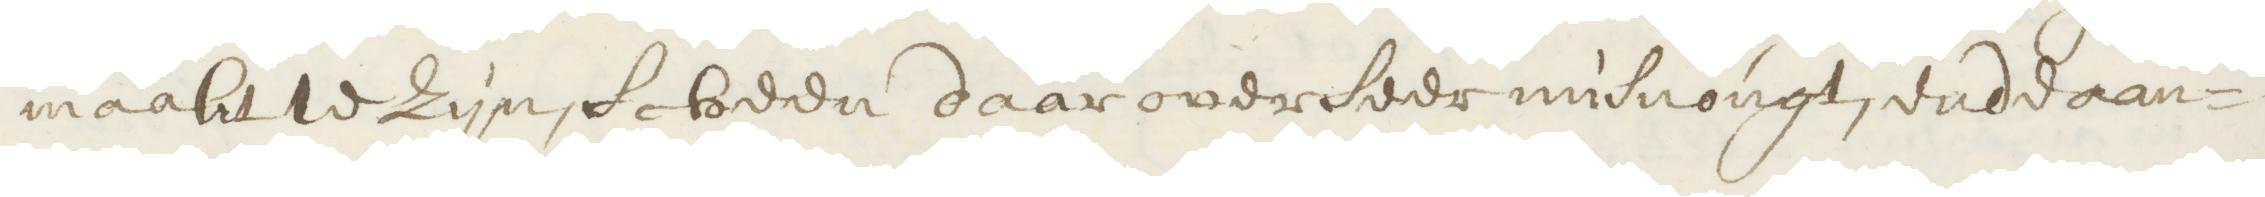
maakt te zijn, scheen daar over seer misnougt, ende aan=
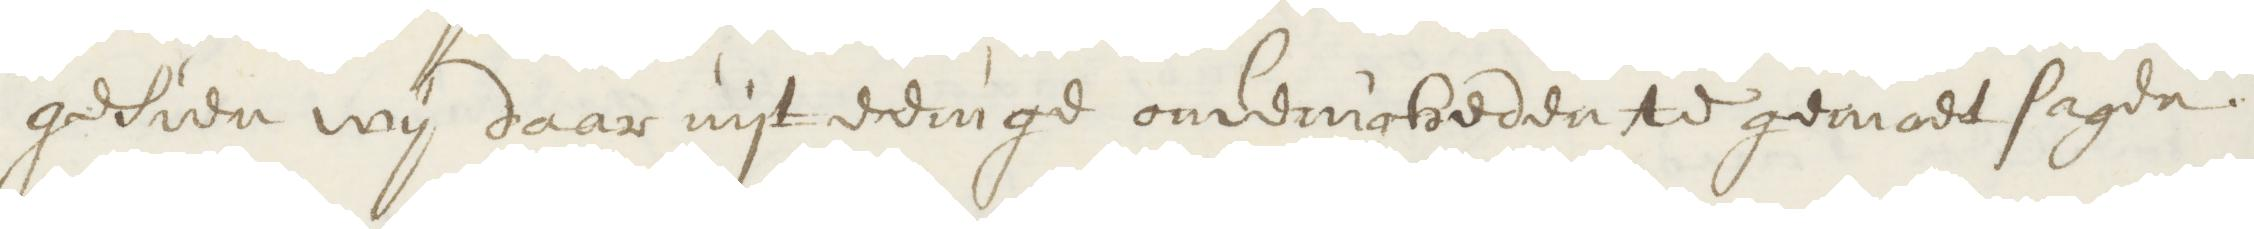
gesien wij daar uijt eenige oneenigheden te gemoet sagen.
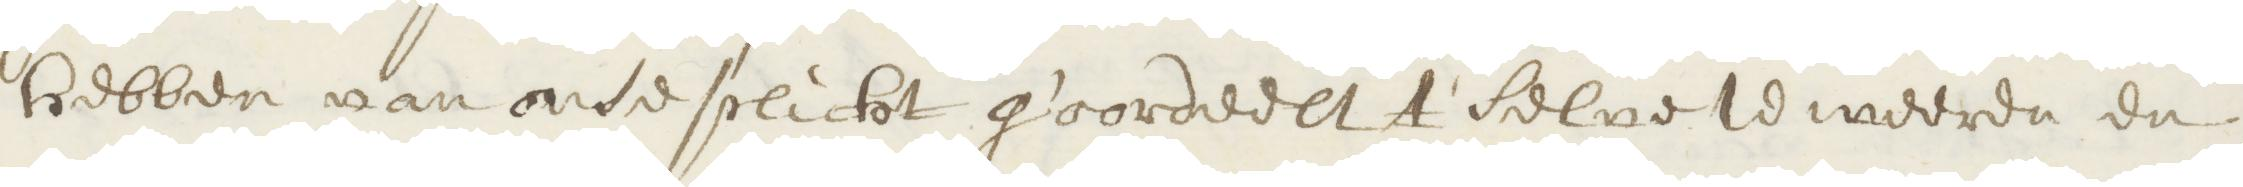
hebben van onse plicht g’oordeelt t’ selve te weeren en
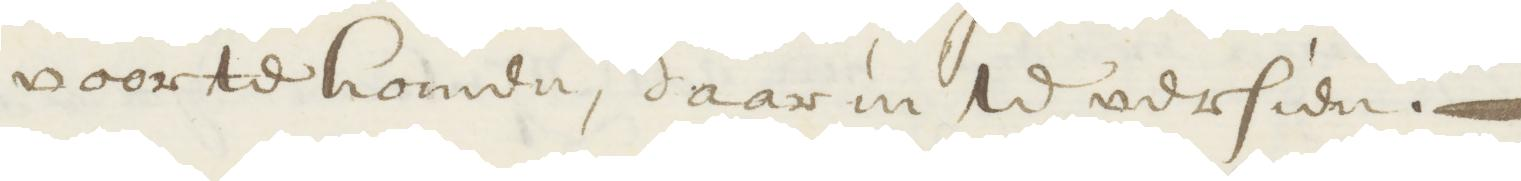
voor te komen, daar in te versien.
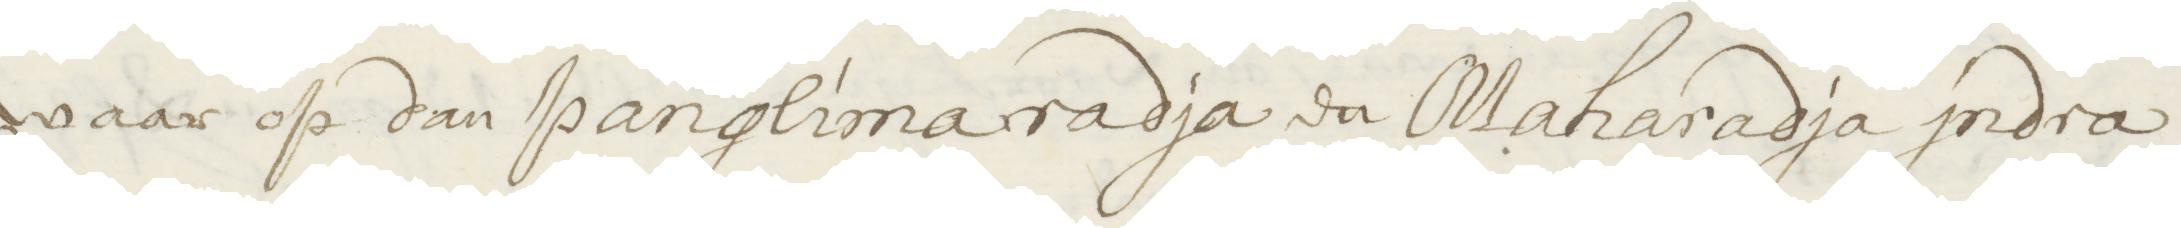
waar op dan panglimaradja en Maharadja Jndra
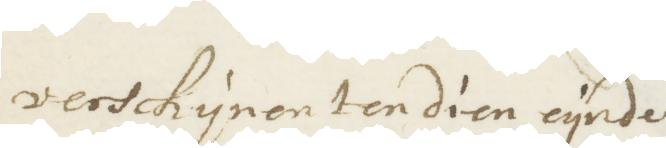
verschijnen ten dien eijnde
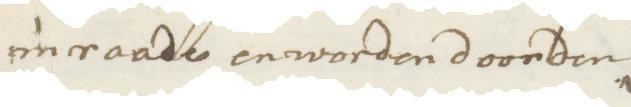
in raade en worden doorden
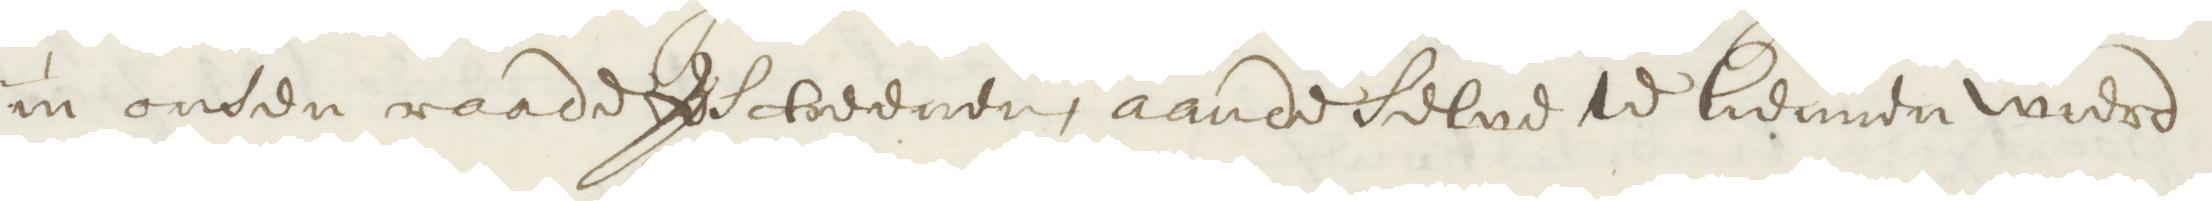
in onsen raade Verscheenen, aan deselve te kennen wierd
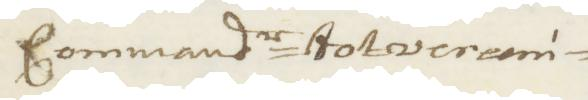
Command=r tot verconi=
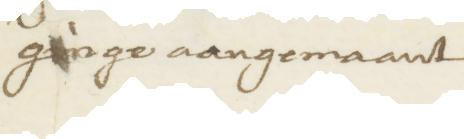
ginge aangemaant
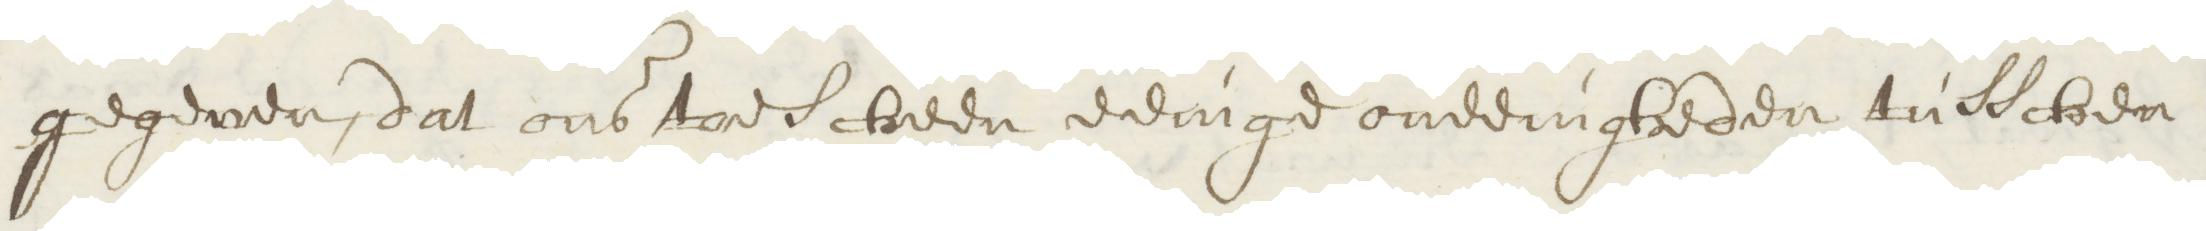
gegeven, dat ons toescheen eenige oneenigheden tusschen
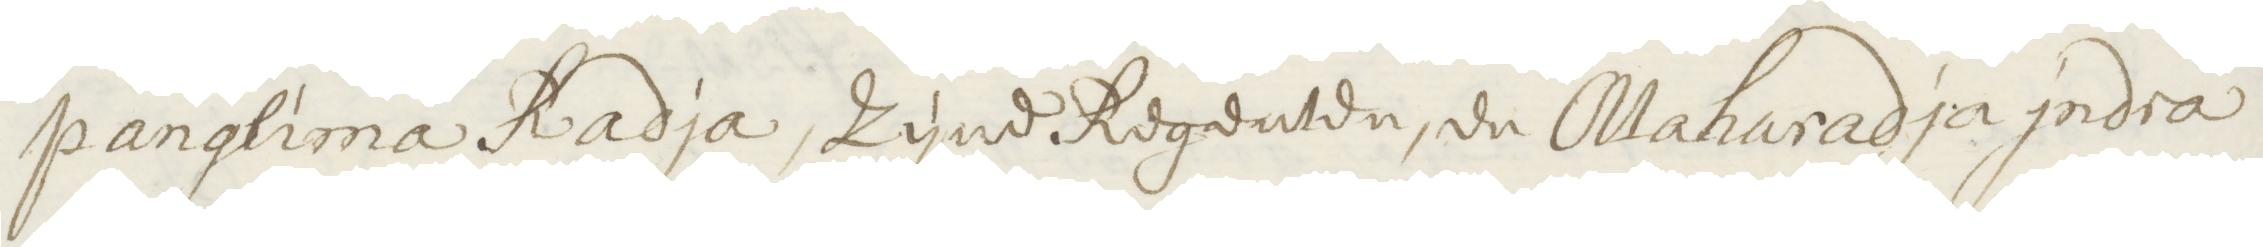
panglima Radja, Zijne Regenten, en Maharadja Jndra
